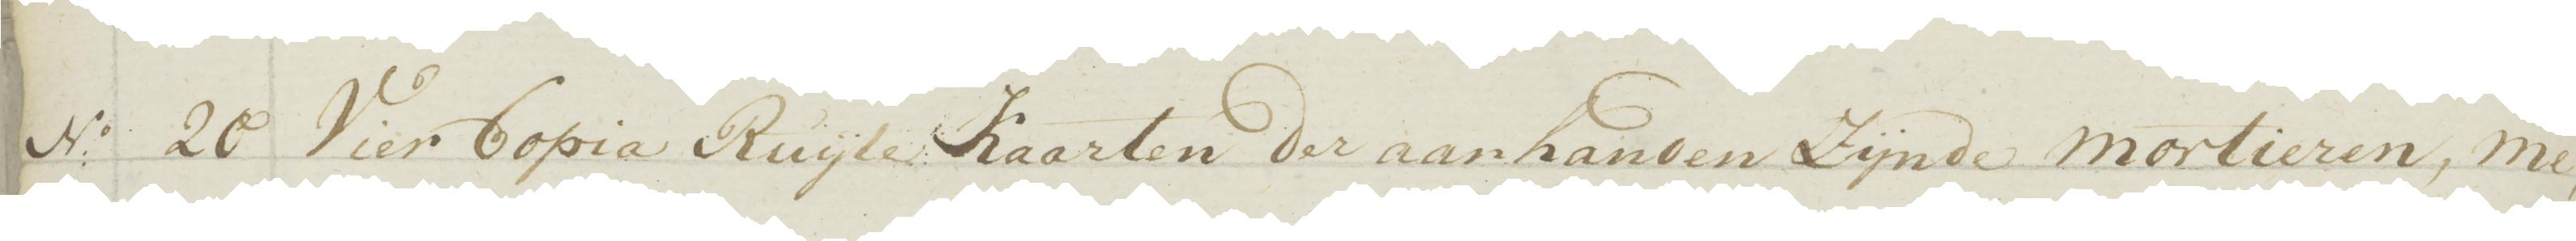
N:o 20 Vier Copia Ruijte Kaarten der aanhanden zijnde mortieren, me
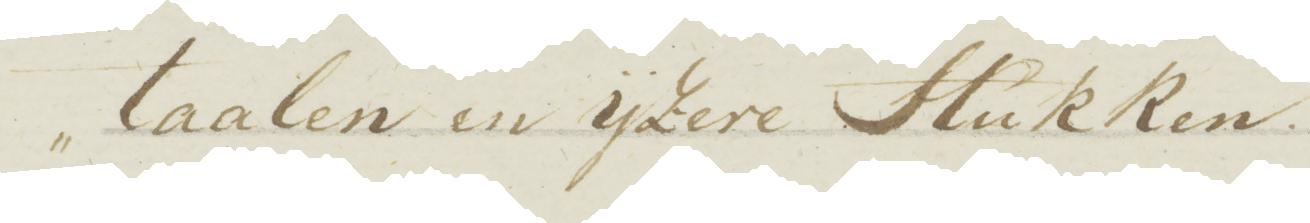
„taalen en ijzere stukken.
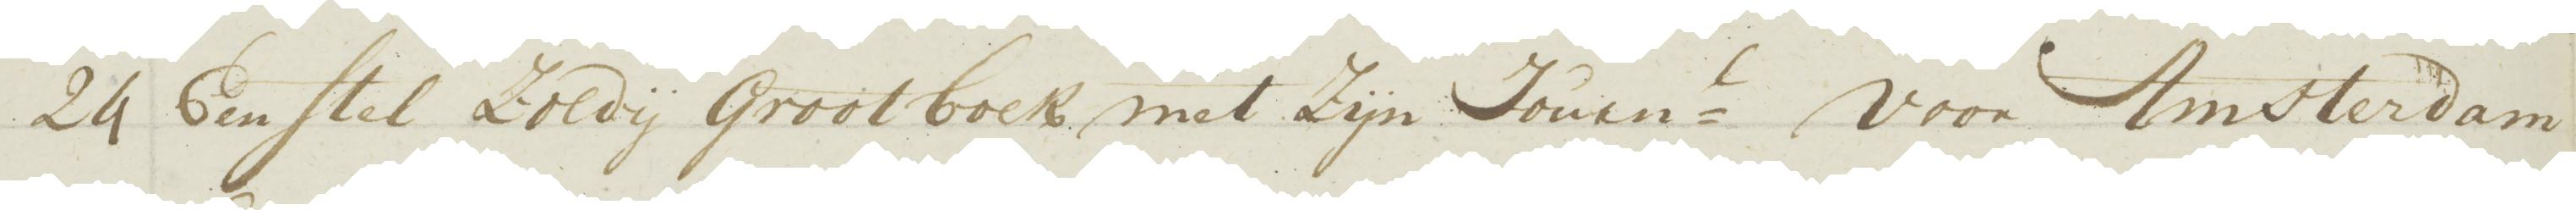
24 Een stel zoldij groot boek met zijn Iourn=l voor Amsterdam
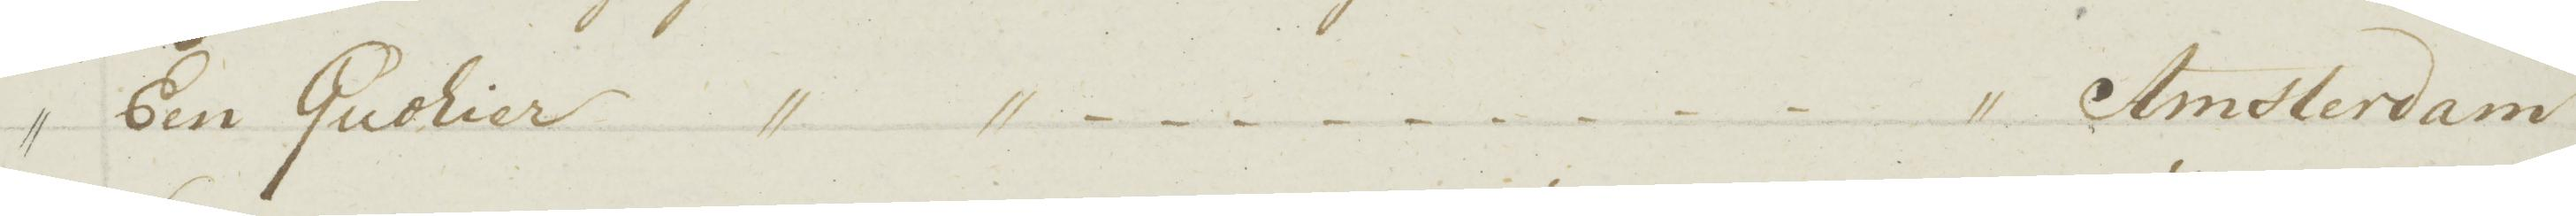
„ Een Quohier „ „ - - - - - - - - - „ Amsterdam
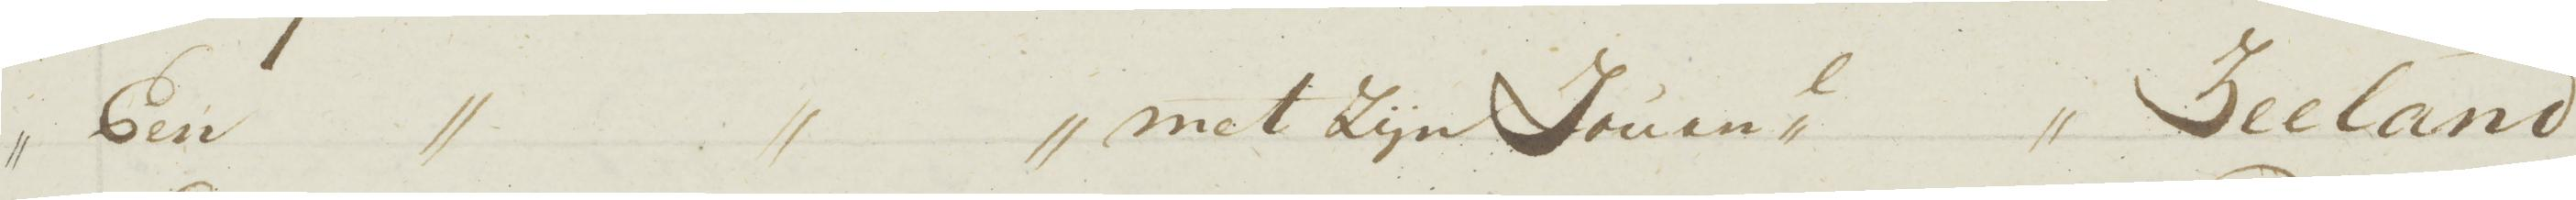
„ Een „ „ „ met zijn Journ„l „ Zeeland
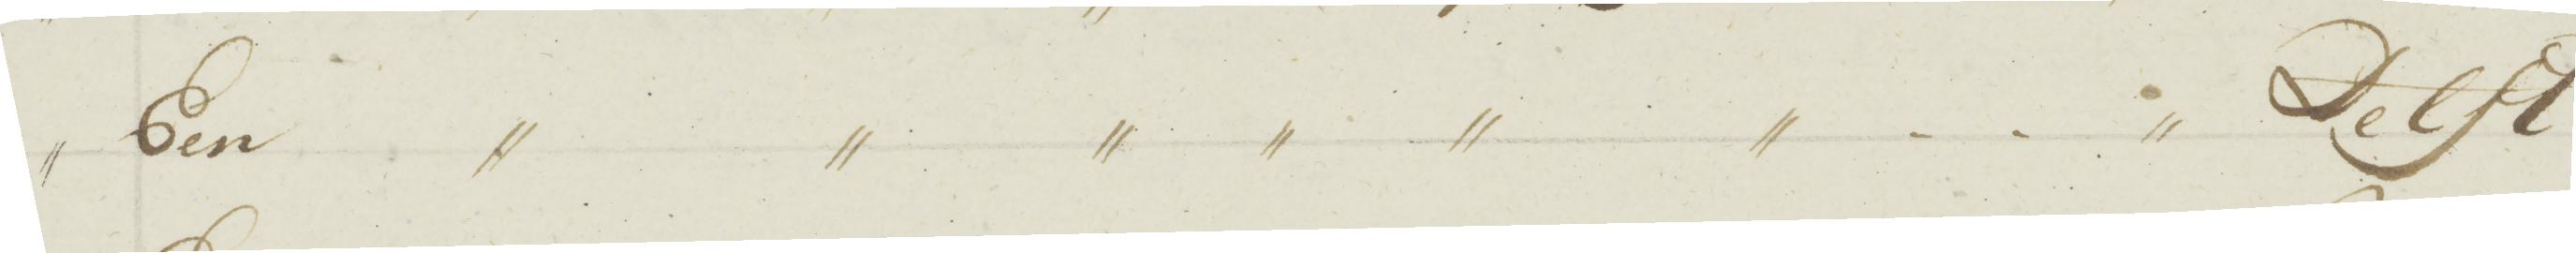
„ Een „ „ „ „ „ „ - - „ Delft
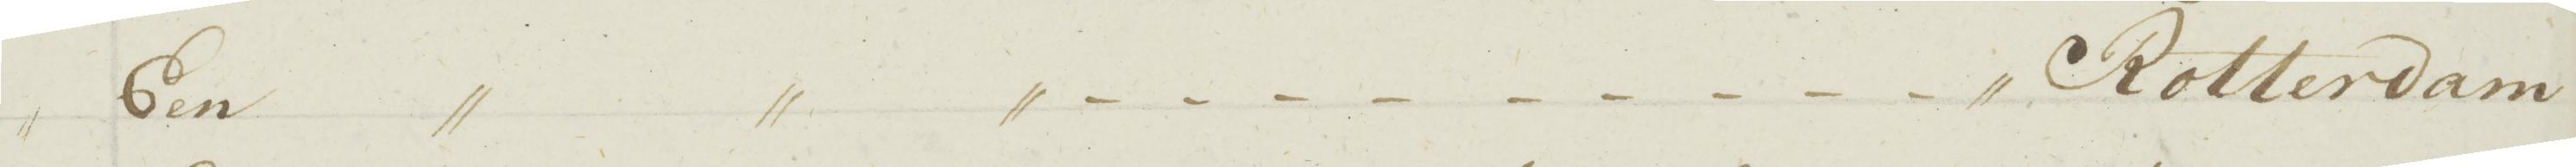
„ Een „ „ „ - - - - - - - - - „ Rotterdam
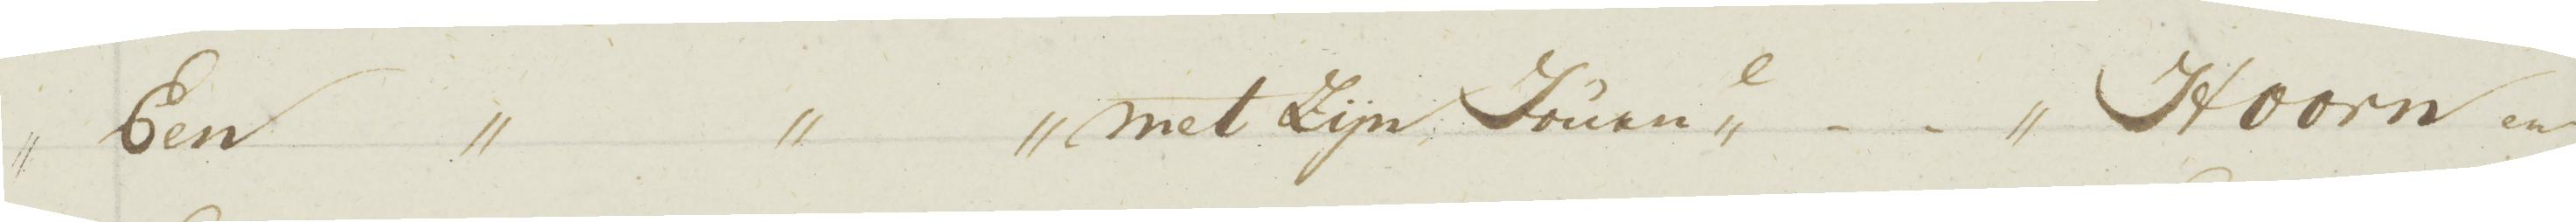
„ Een „ „ „ met zijn Iourn„l - - „ Hoorn en
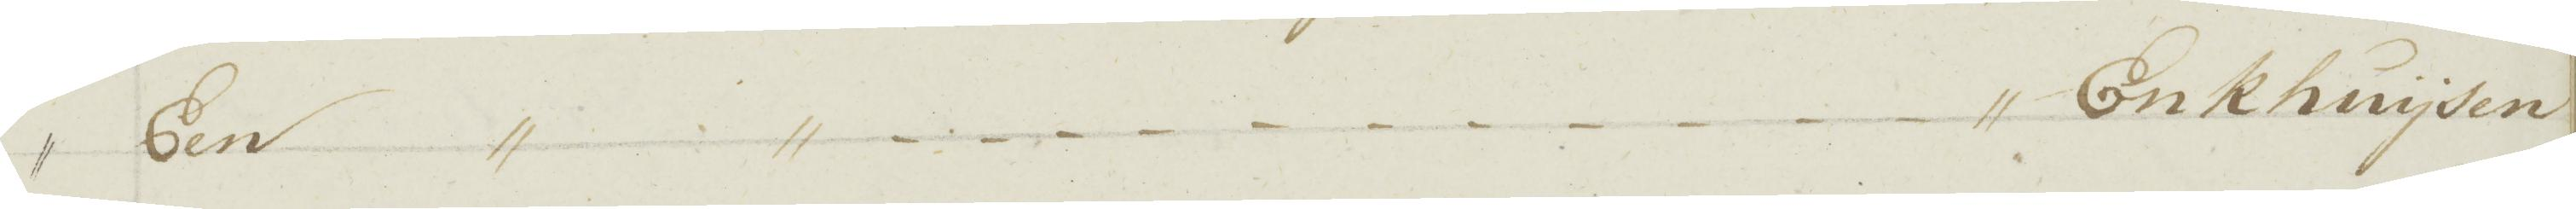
„ Een „ „ - - - - - - - - - - - „ Enkhuijsen
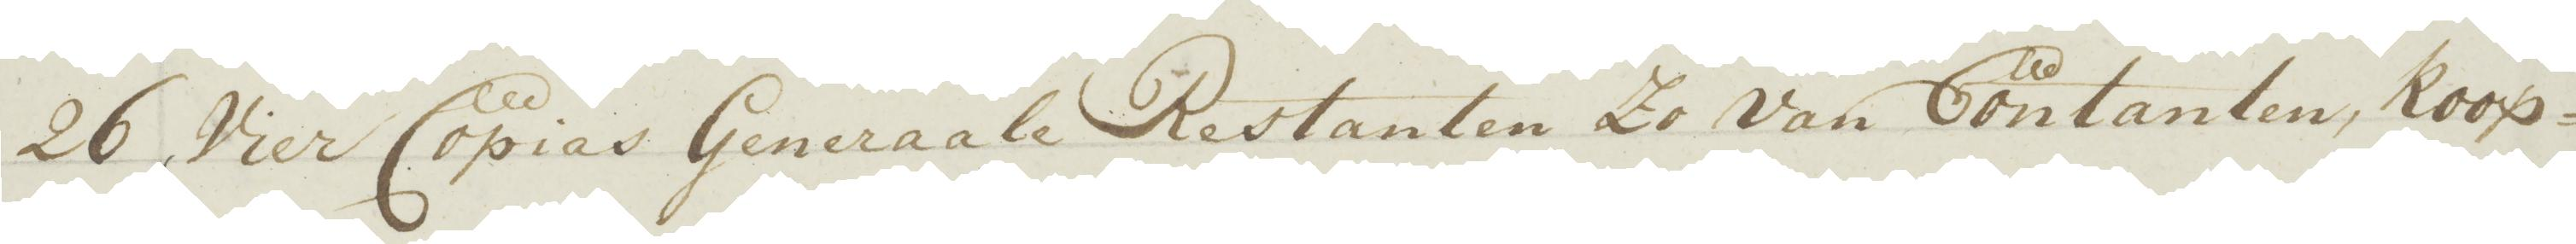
26 Vier copias Generaale Restanten zo van Contanten, koop-
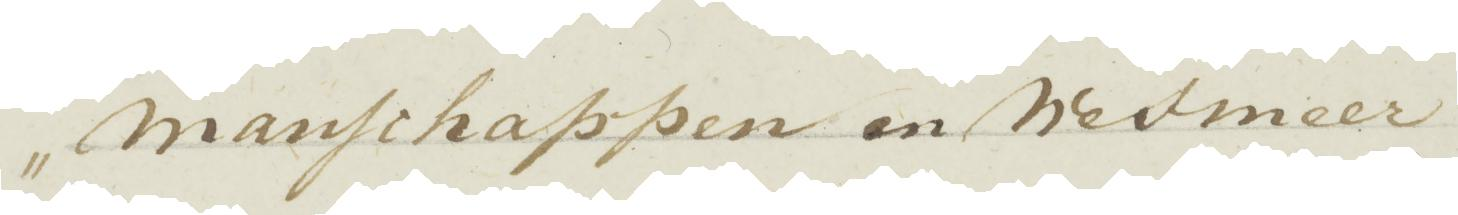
„manschappen en wesmeer
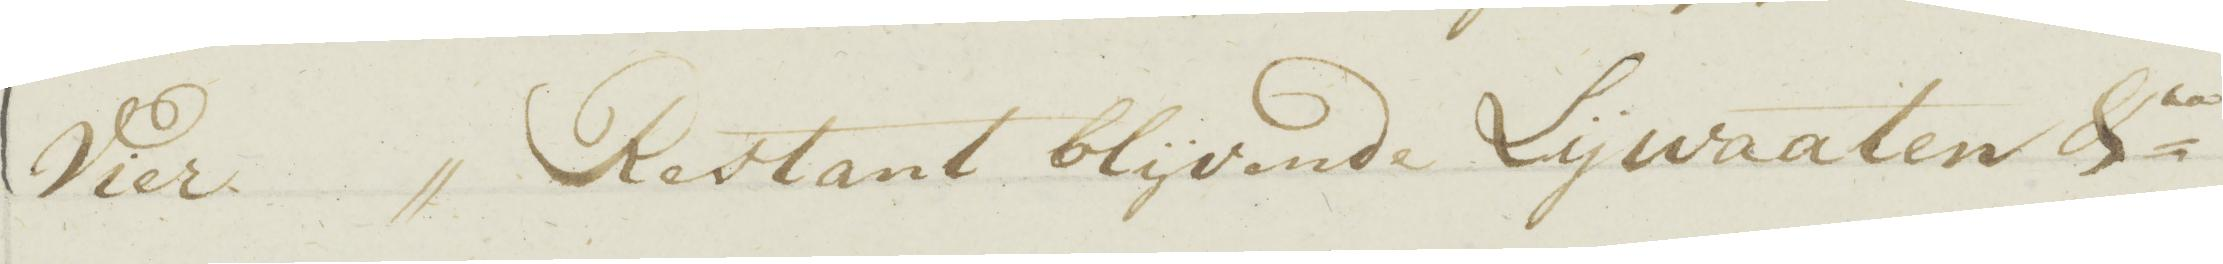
Vier. „ Restant blijvende Lijwaaten Et=a
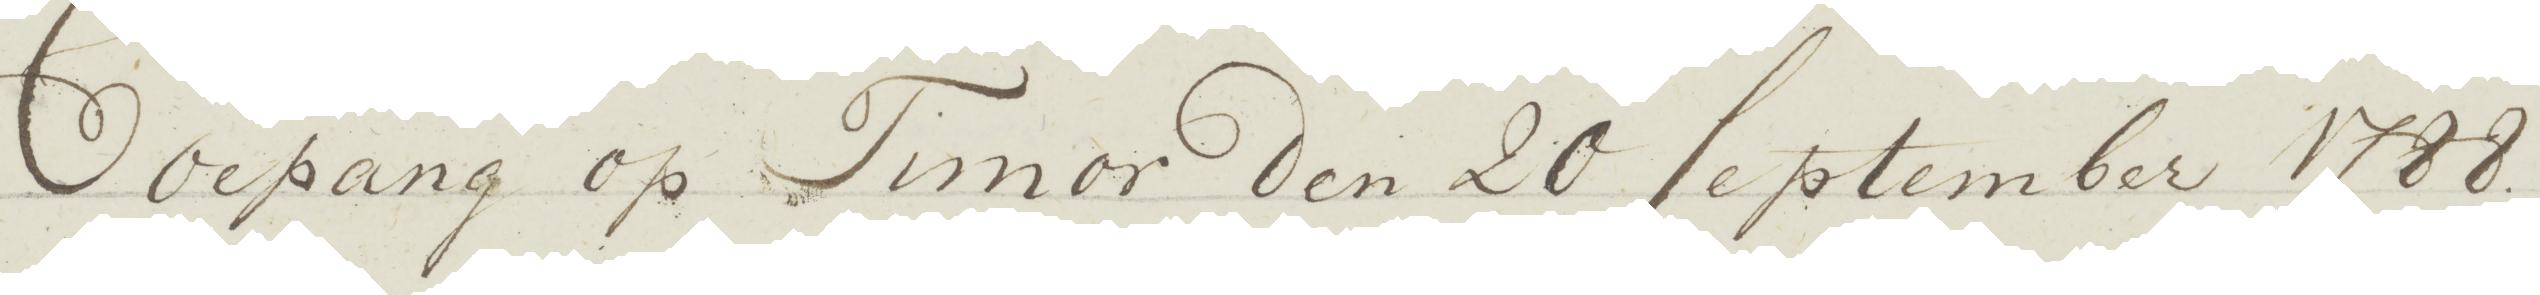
Coepang op Timor den 20 september 1788.
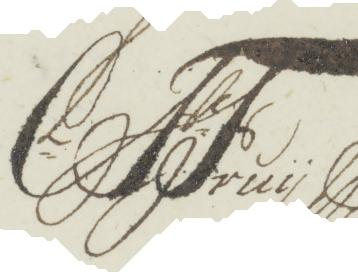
Cl: T=de Fruij
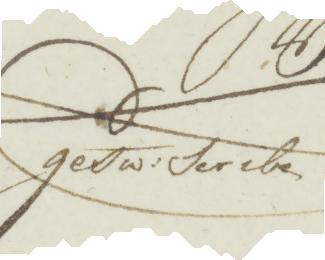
gesw: seriben
